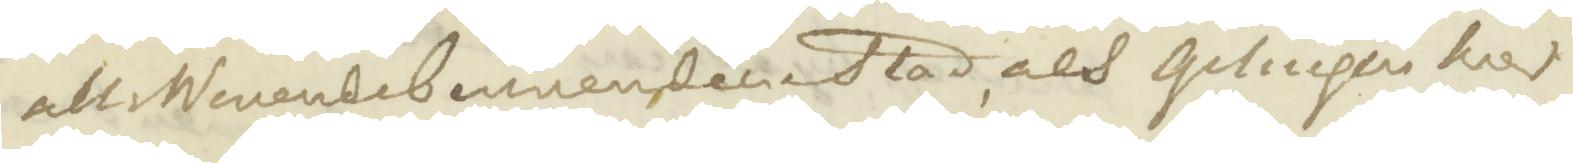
alle wonende binnen, deze Stadm als getuigen hier
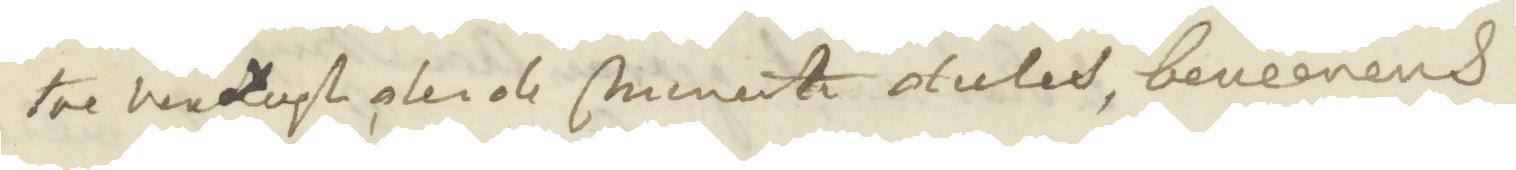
toe verzogt, der de minute deeses, beneevens
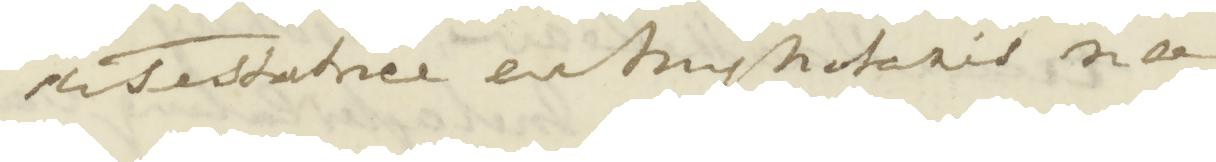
de Testatrice en my notaris na
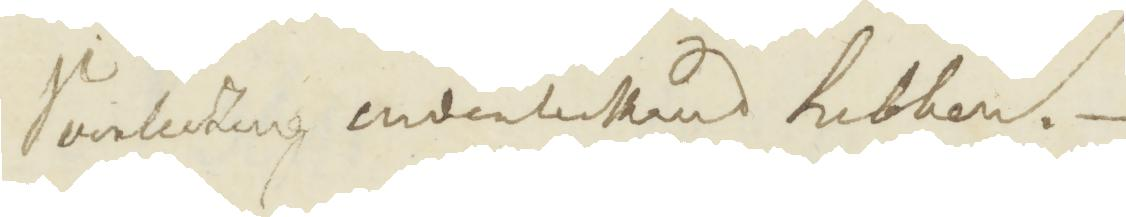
Voorleezing onderteekend hebben.
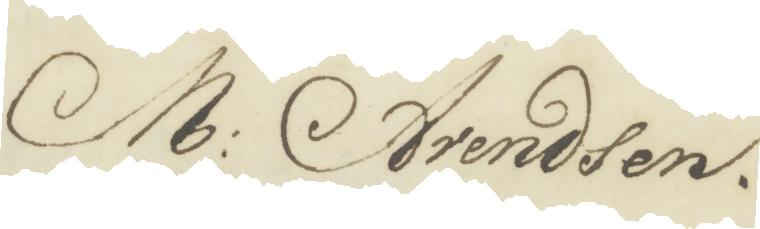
M: Arendsen.
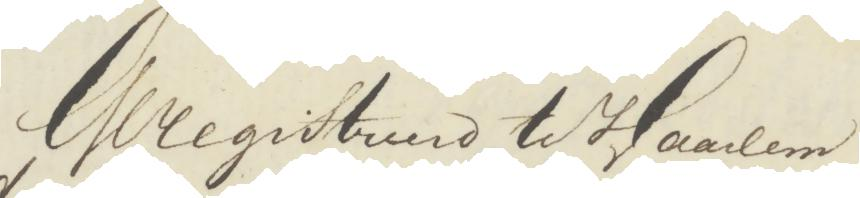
Gregisteerd te Haarlem
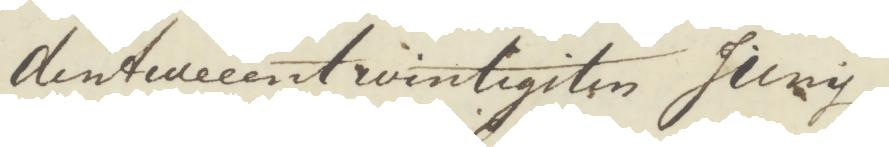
den tweeentwintigsten Junij
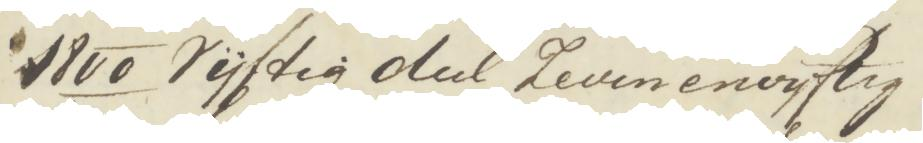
1800 Vijftig deel Zeven en vyftig
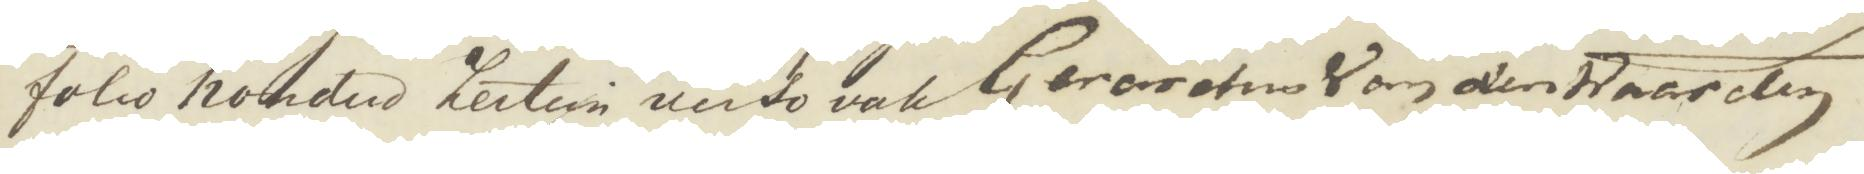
folio honderd zestien verso vak Gerardes van der Waarden
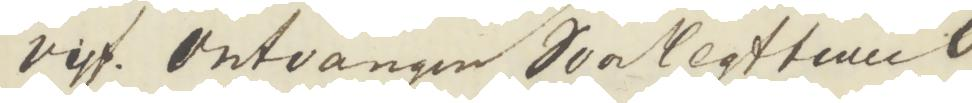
vijf. Ontvangen Voor regt twee
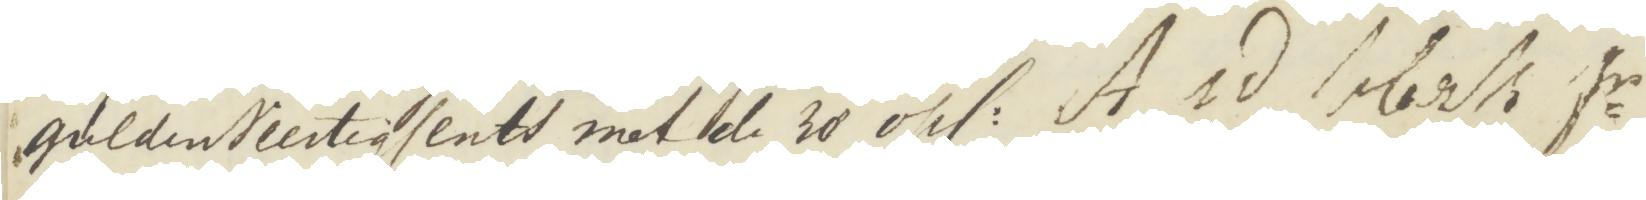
gulden Veertig Cents met de 20 opC: A id Vlerk J=r
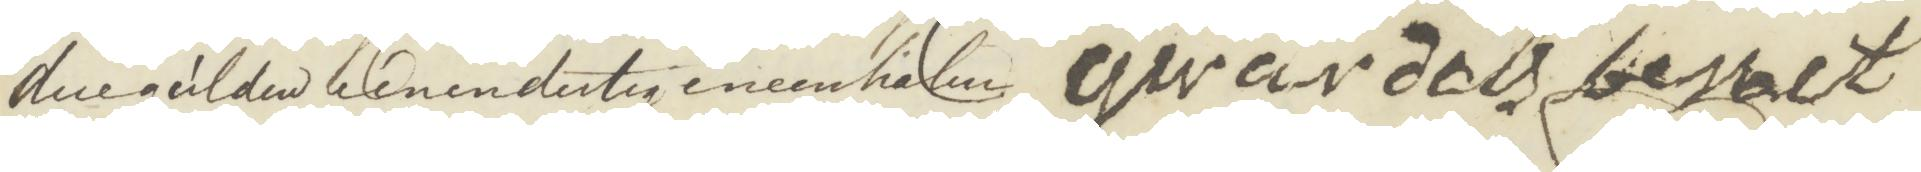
drie gulden eenendertig en een halve gerardus byvoet
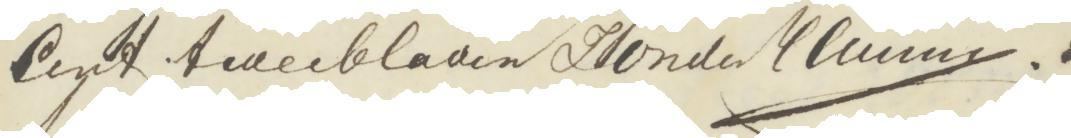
Cent twee bladen zonder Renvooy.
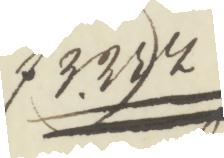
ƒ3.314
